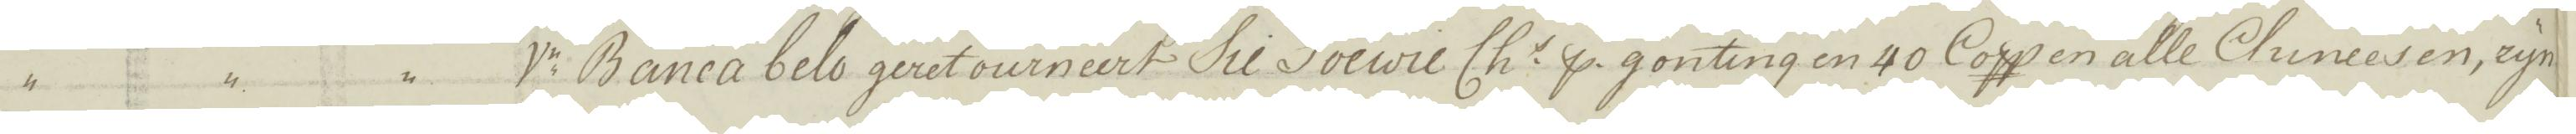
„ „ „ v„n Banca belo geretourneert Sie Soewie Ch.s p. gonting en 40 Coppen alle Chineesen, zijn
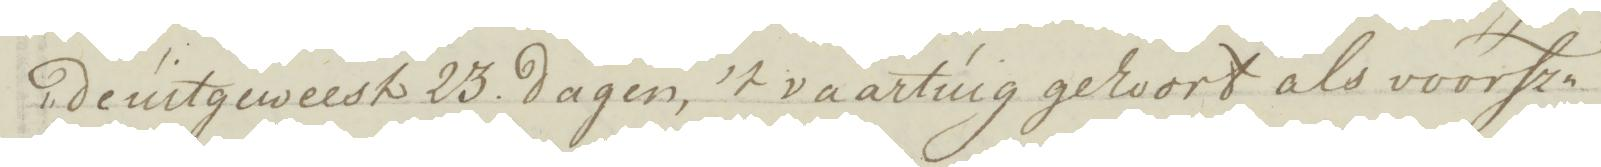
de uitgeweest 23. dagen, ’t vaartuig gehoort als voorsz„
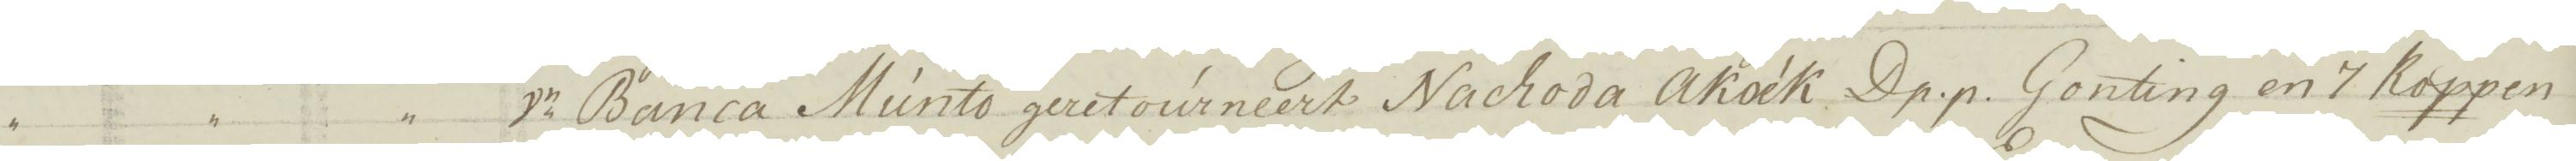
„ „ „ v„n Banca Munto geretourneert Nachoda Akoek Dp. p. Gonting en 7 koppen
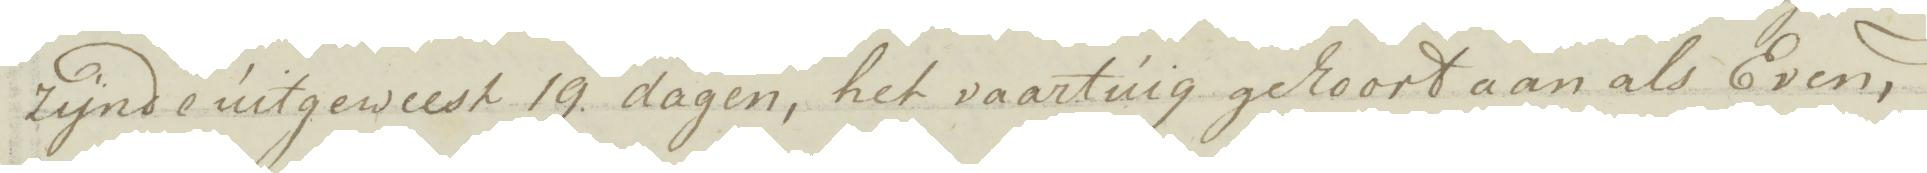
zijnde uitgeweest 19. dagen, het vaartuig gehoort aan als Even,
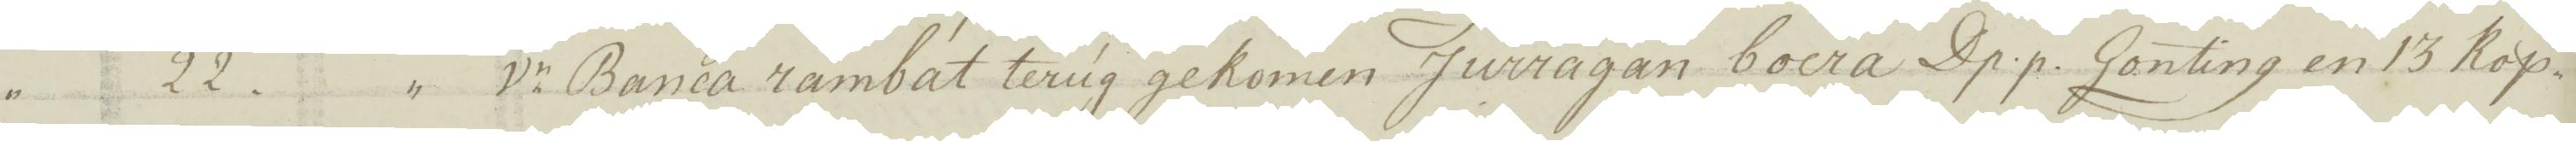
„ 22. „ v„n Banca rambat terug gekomen Jurragan boera Dp. p. Gonting en 13 kop„
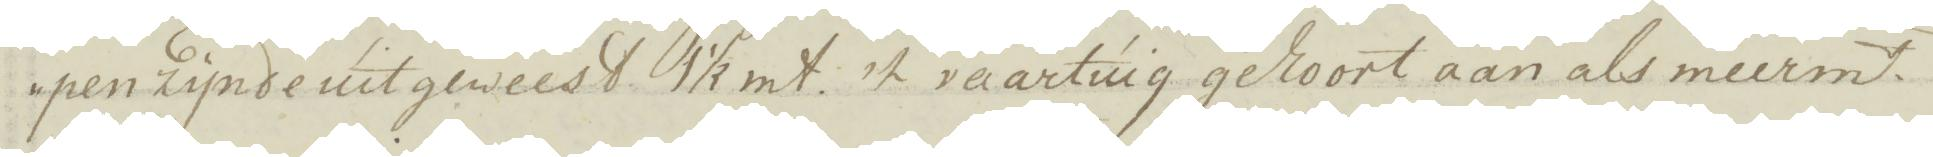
„pen zijnde uitgeweest 1½ mt. 't vaartuig gehoort aan als meerm.t
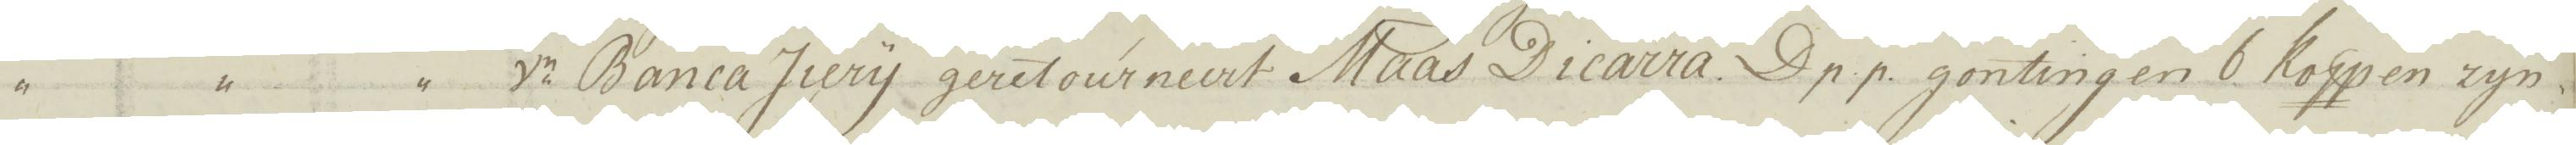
„ „ „ v„n Banca Jierij geretourneert Maas Dicarra. Dp. p. gonting en 6 koppen zijn
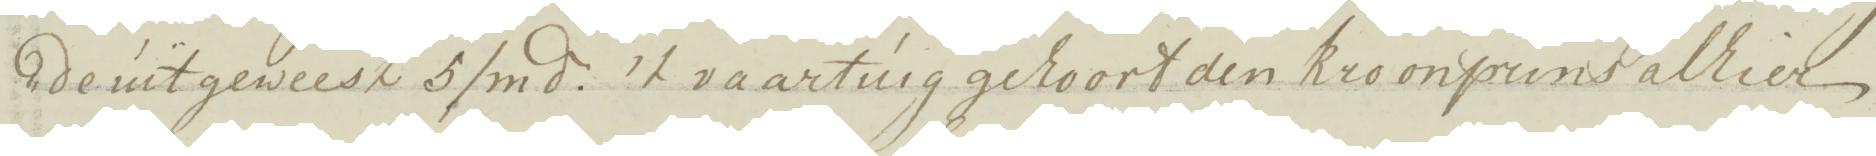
„de uitgeweest 5/md.n ’t vaartuig gehoort den kroonprins alhier
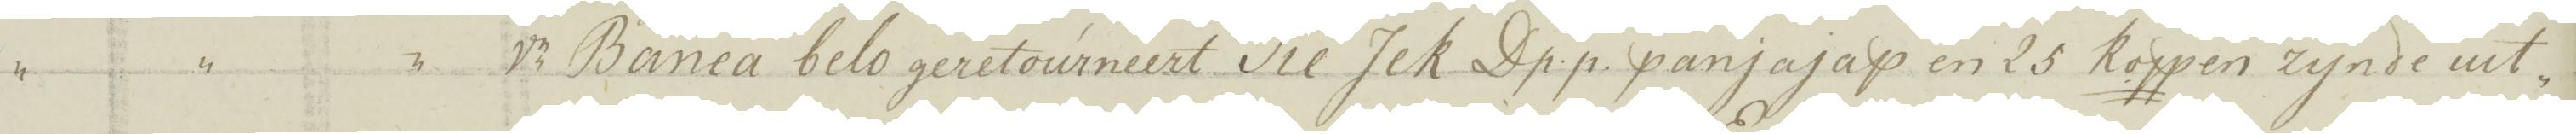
„ „ „ v„n Banca belo geretourneert Sie Jek Dp. p. panjajap en 25 koppen zijnde uit„
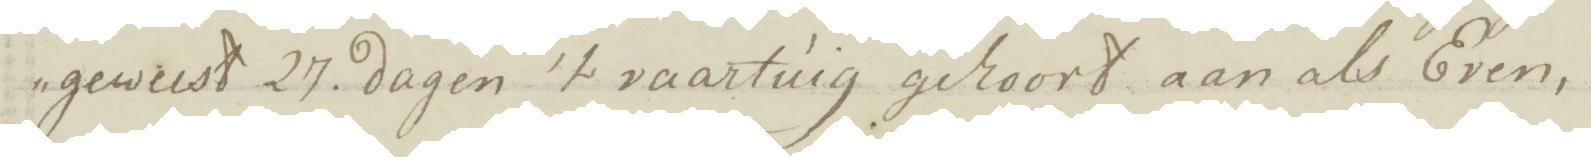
„geweest 27. dagen ’t vaartuig gehoort aan als Even,
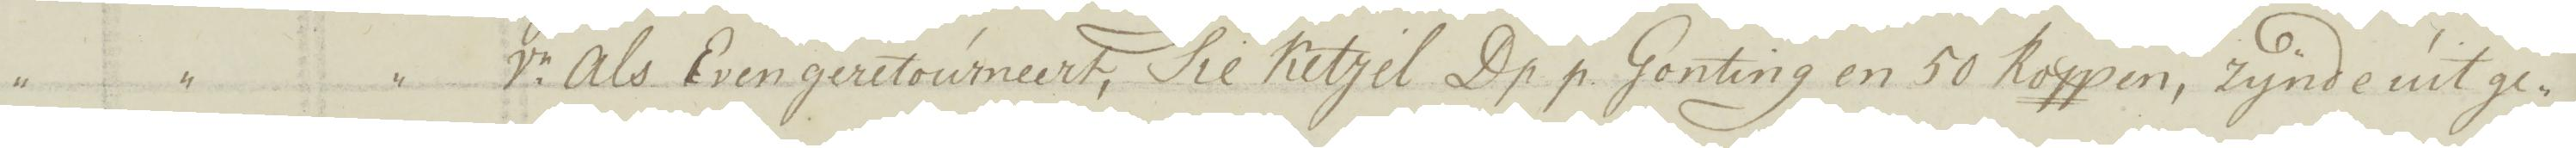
„ „ „ v„n als Even geretourneert, Sie ketjel Dp p. Gonting en 50 koppen, zijnde uit ge„
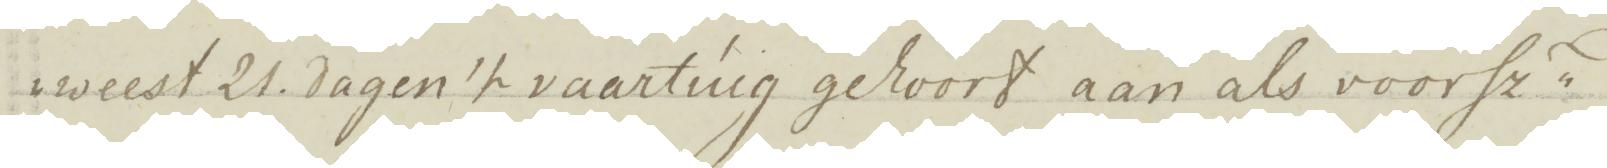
„weest 21. dagen ’t vaartuig gehoort aan als voorsz„
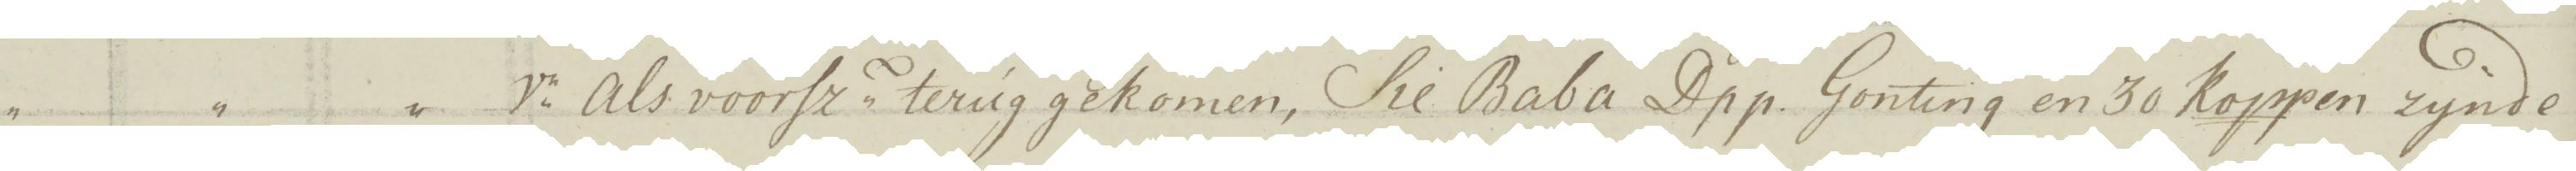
„ „ „ v„n als voorsz„ terug gekomen, Sie Baba Dpp. Gonting en 30 koppen zijnde
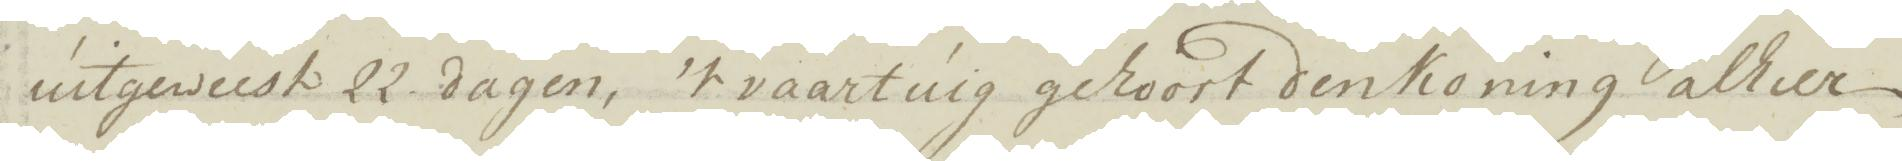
uitgeweest 22. dagen, ’t vaartuig gehoort den koning alhier
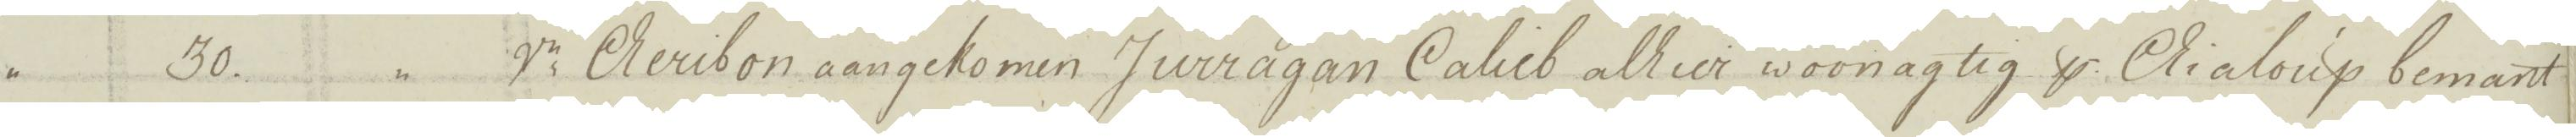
„ 30. „ v„n Cheribon aangekomen Jurragan Calieb alhier woonagtig p: Chialoup bemant
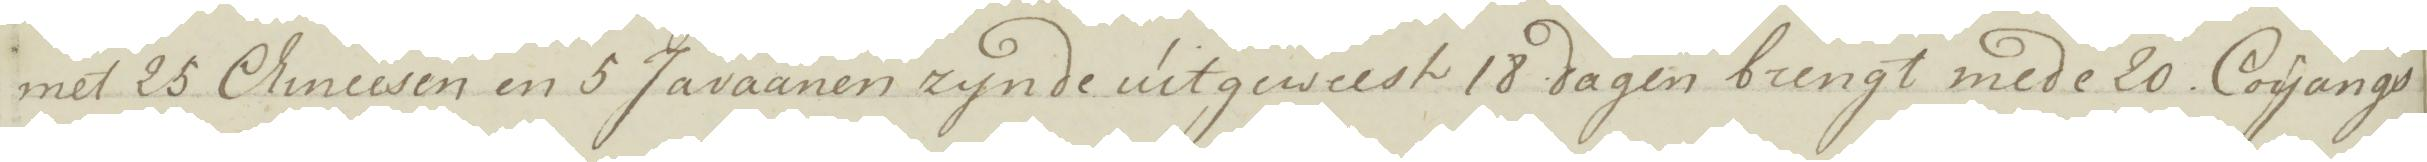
met 25 Chineesen en 5 Javaanen zynde uitgeweest 18 dagen brengt mede 20. Coijangs
